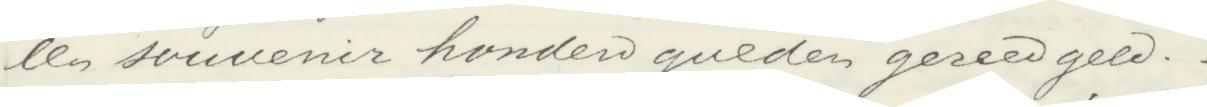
een souvenir honderd gulden gereed geld.
